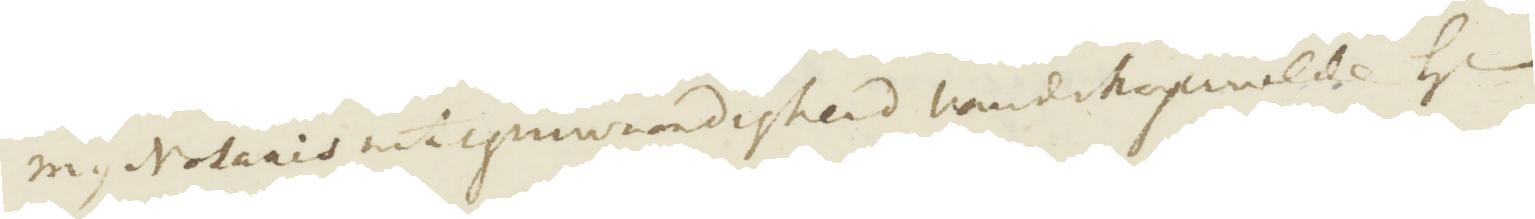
my Notaris integenwoordigheid van de nagemelde Ge
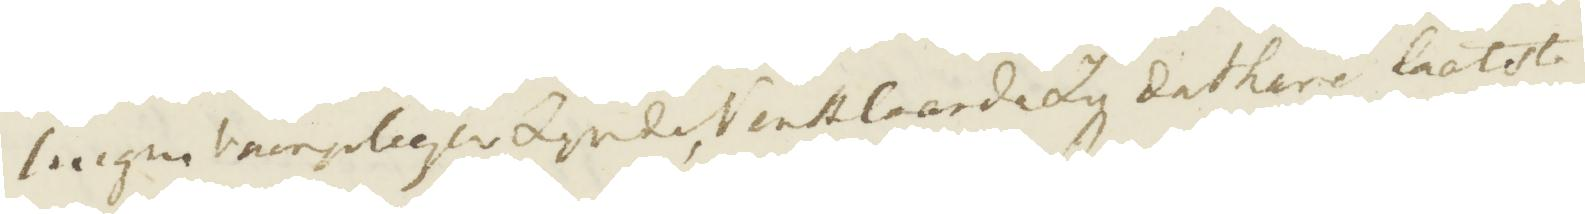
tuigen voorgelezen zynde, Verklaarde zy dat hare laatste
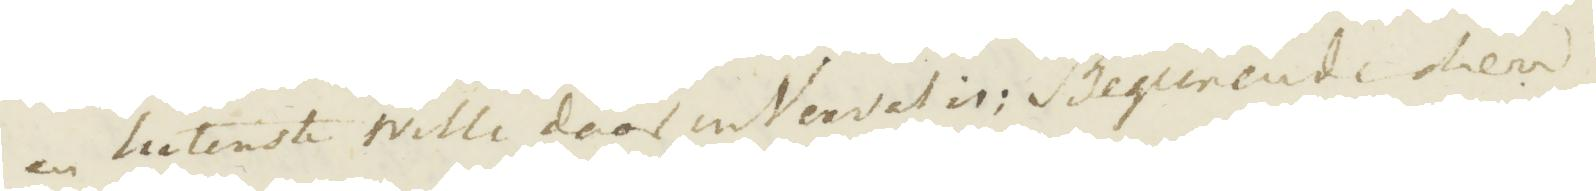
en Uiterste wille daar in Vervat is; Begeerende dien
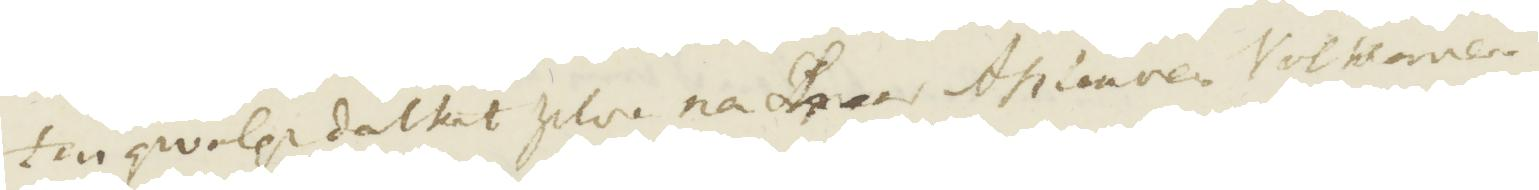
ten gevolge dat het zelve na haar Afsterven Volkomen
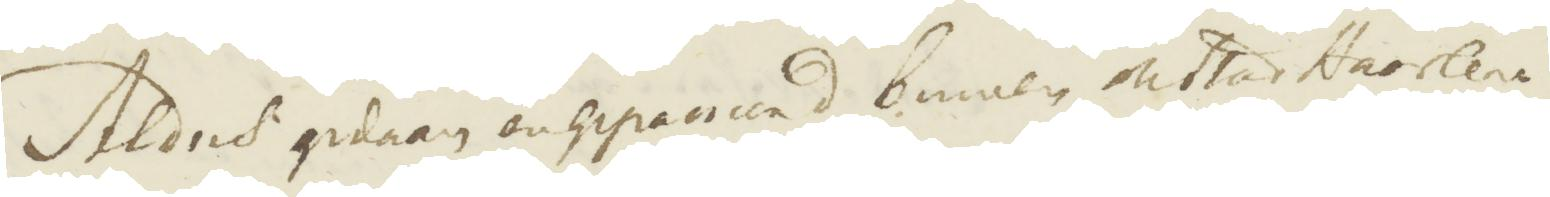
Aldus gedaan en gepasseerd binnen de stad Haarlem
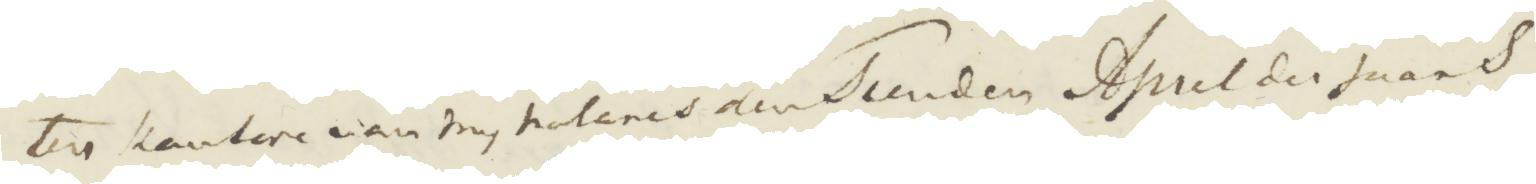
ten kantore van my notaris den Tienden April des Jaars
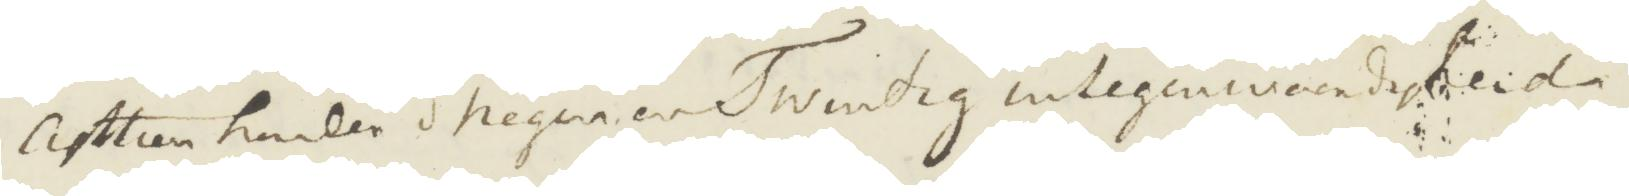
Agttien honderdnegenen Twintig integenwoordigheid
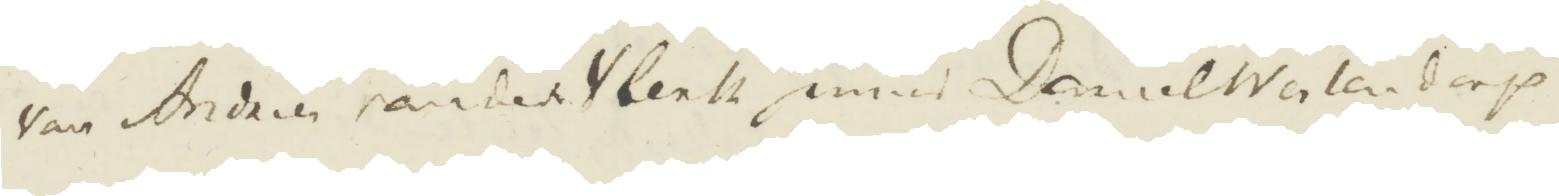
van Andries van der Vlerk, Jannes Daniel Westendorp
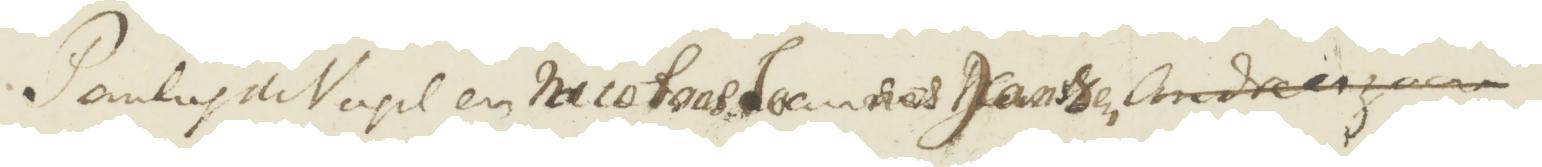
Paulus de Vogel en Nicolaas Johannes Jansen Andreaszoon
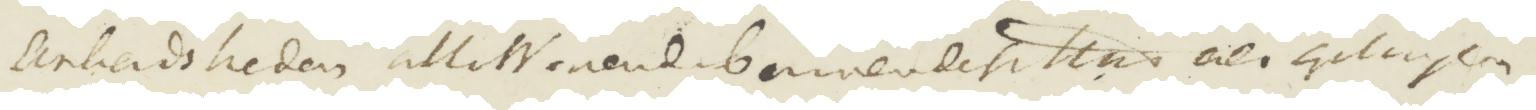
Ambadslieden alle Wonende binnen dese stad als getuigen
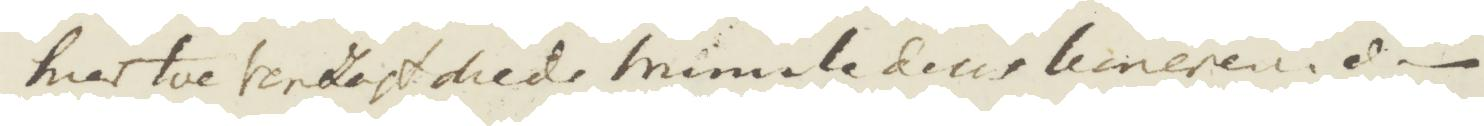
hier toe verzogt die de minute benevens de
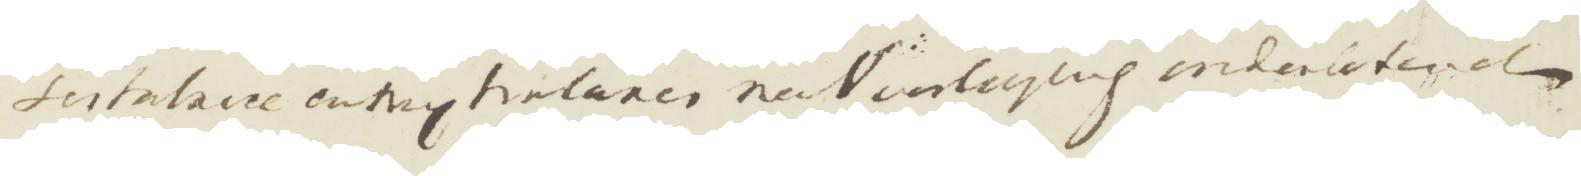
Testatrice en my notaris na Voorlezing ondertekend
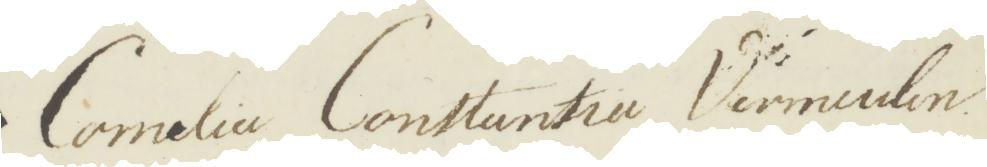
Cornelia Constantia Vermeulen
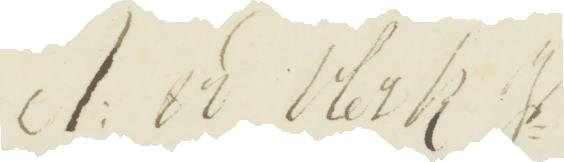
A: de Vlerk J=r
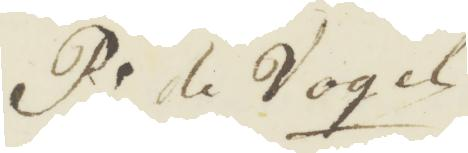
P.s de Vogel
